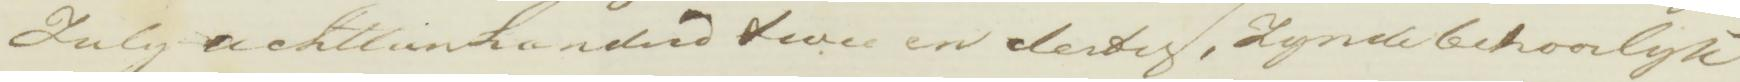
Iuly achttienhonderd twee en dertig, zynde behoorlyk
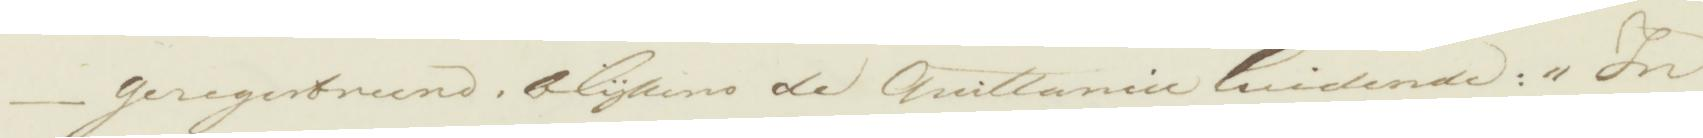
— geregistreerd, blijkens de Quittancie luidende: „ In
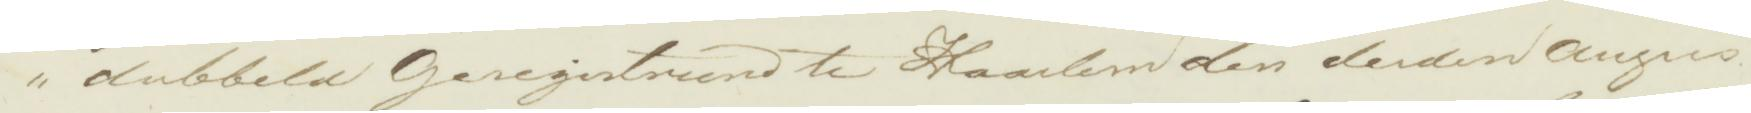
„ dubbeld Geregistreerd te Haarlem den derden Augus.
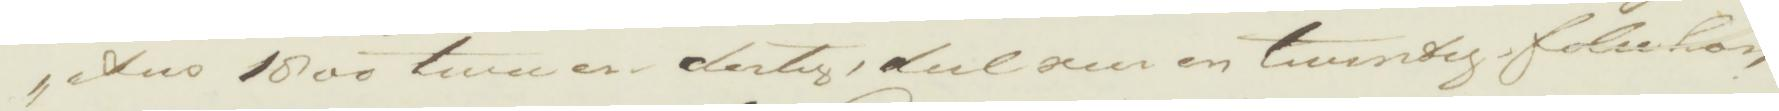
„ tus 1800 twee en dertig, deel vier en twintig, folio hon
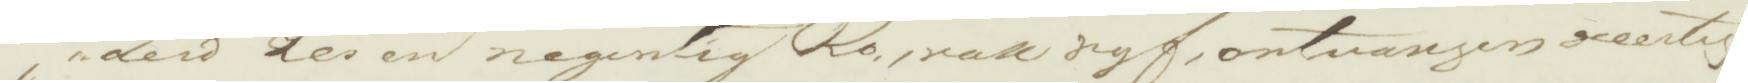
„ „derd zes en negentig Ro., vak vyf, ontvangen veertig
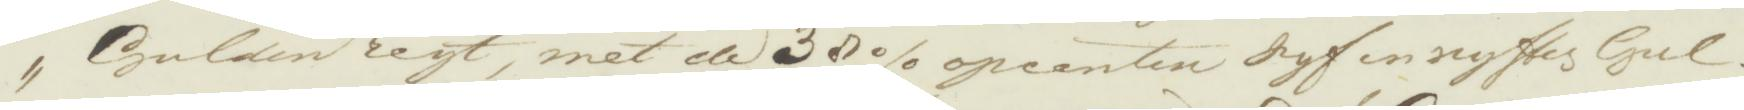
„ Gulden regt, met de 38% opcenten vyf en vyftig Gul
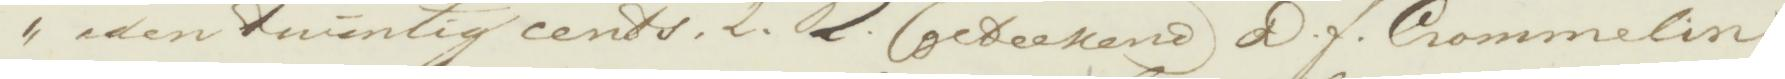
„ „den twintig cents. Z. R. (geteekend) D.f. Crommelin
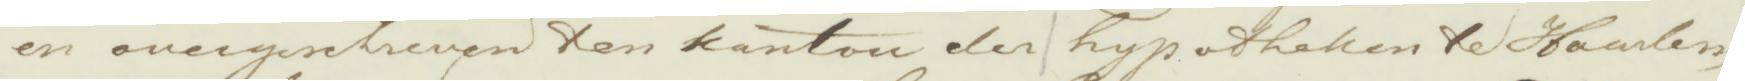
en overgeschreven ten kantore der hypotheken te Haarlem,
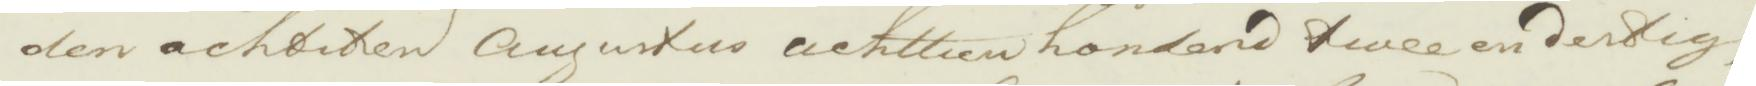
den achtsten Augustus achttien honderd twee en dertig,
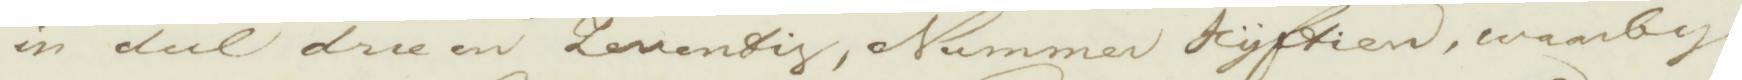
in deel drie en zeventig, Nummer vijftien, waarby
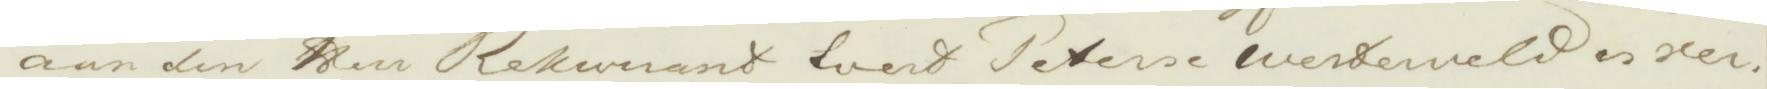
aan den Heer Rekwirant Evert Peterse westerveld is ver
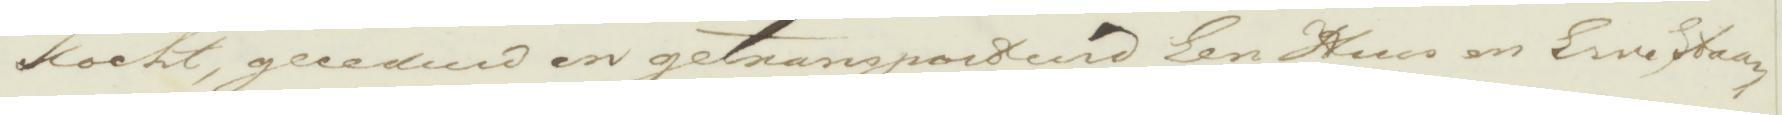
kocht, gecedeerd en getransporteerd Een Huis en Erve staan,
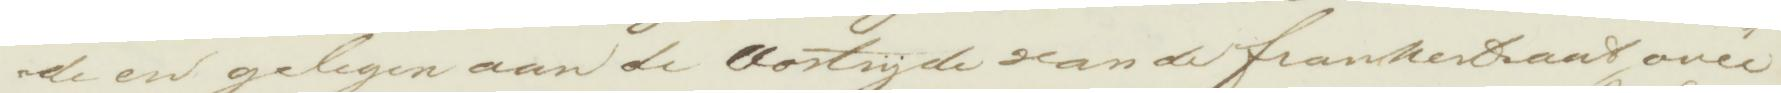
„de en gelegen aan de Oostzijde van de frankestraat over
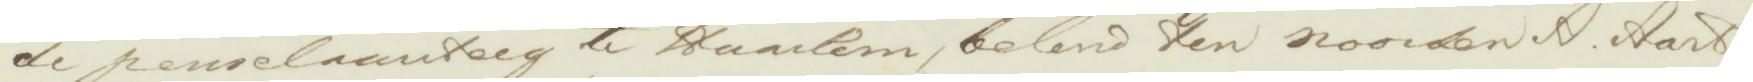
de peuzelaarsteeg te Haarlem, belend ten noorden A. Aart
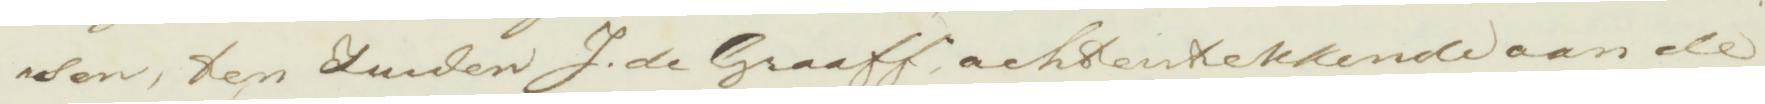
sen, ten zuiden J. de Graaff, achterstrekkende aan de
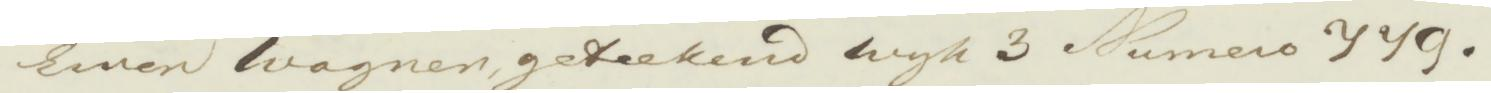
Erven Wagner, geteekend wyk 3 Numero 779.
